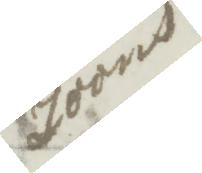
zoons
